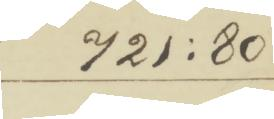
721:80
